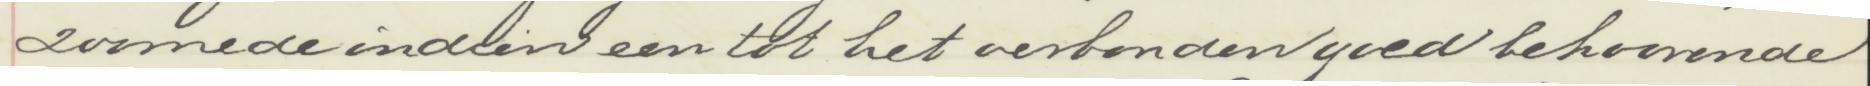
zoomede indien een tot het verbonden goed behoorende
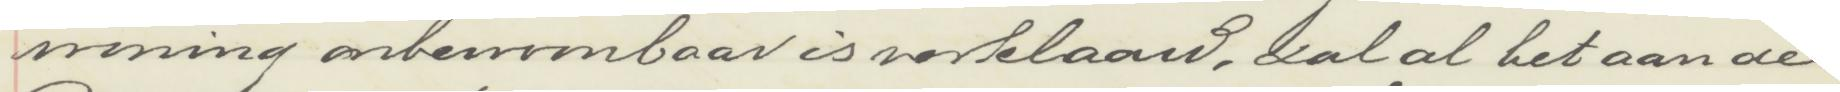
woning onbewoonbaar is verklaard, zal al het aan de
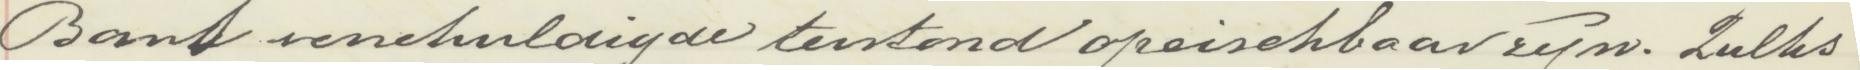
Bank verschuldigde terstond opeischbaar zijn. Zulks
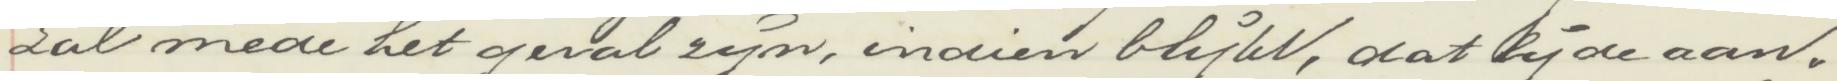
zal mede het geval zijn, indien blijkt, dat bij de aan„
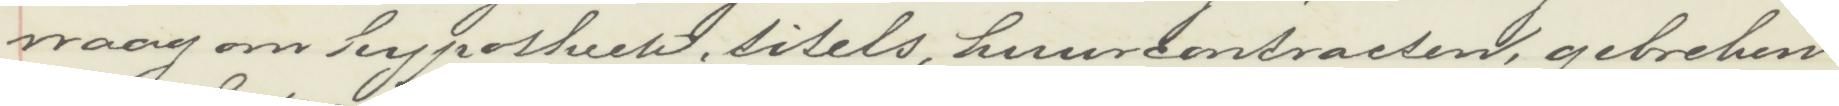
vraag om hypotheek, titels, huurcontracten, gebreken
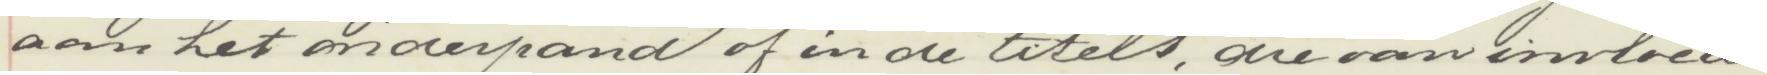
aan het onderpand of in de titels, die van invloed
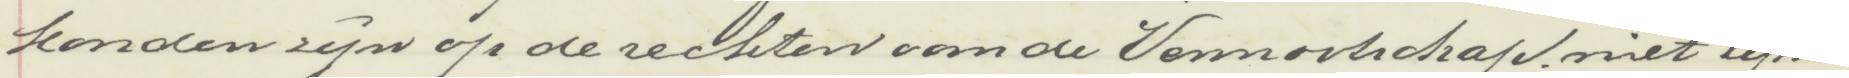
konden zijn op de rechten van de Vennootschap, niet zijn
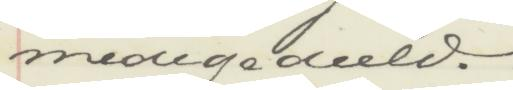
medegedeeld.
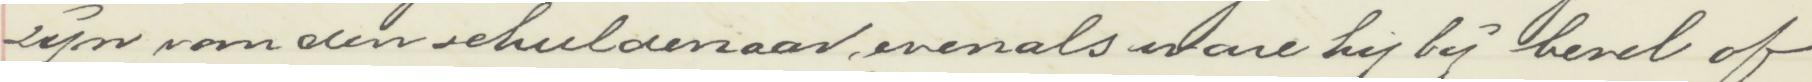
zijn van den schuldenaar, even als ware hij bij bevel of
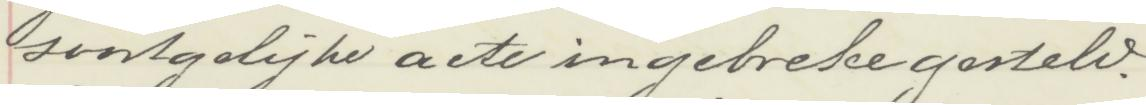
sontgelijke acte ingebreke gesteld.
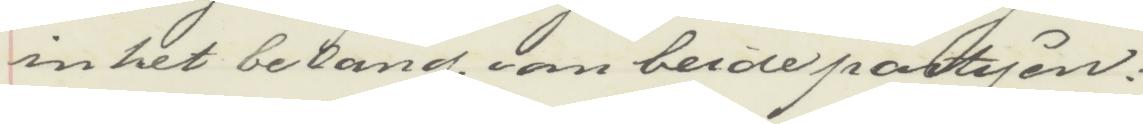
in het belang. van beide partijen:
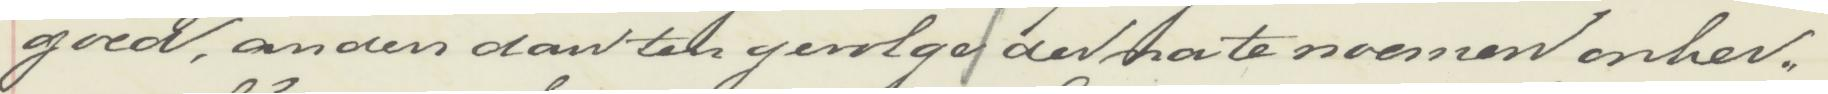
goed, anders dan ten gevolge der na te noemen onher„
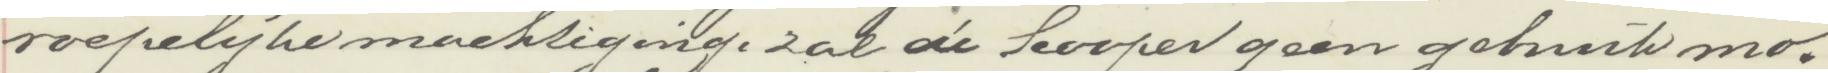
roepelijke machtiging, zal de kooper geen gebruik mo„
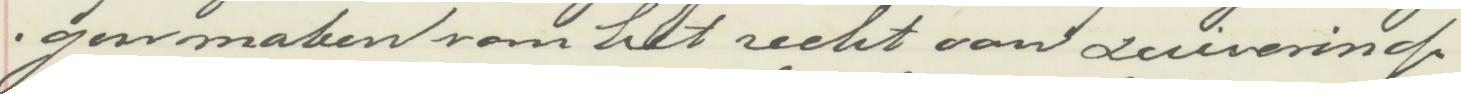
gen maken van het recht van zuivering.
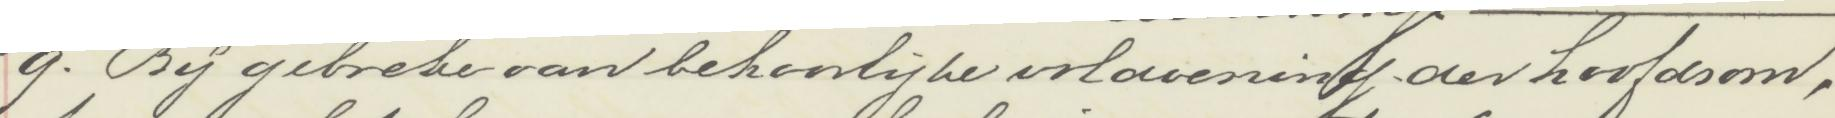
9. Bij gebreke van behoorlijke voldoening der hoofdsom,
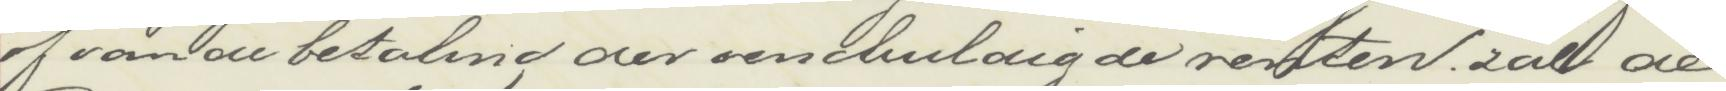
of van de betaling der veschuldigde renten, zal de
